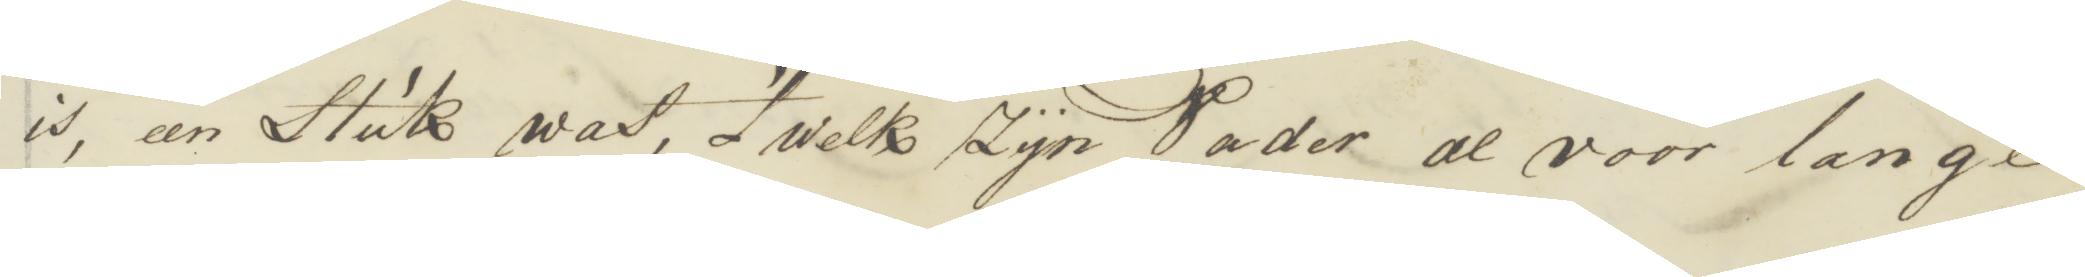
is, een stuk was, 't welk zijn Vader al voor lange
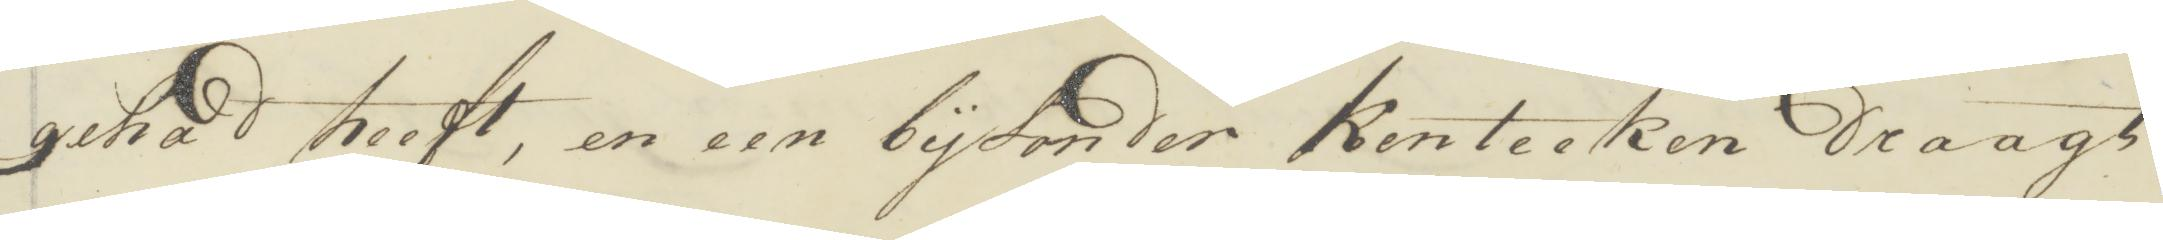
gehad heeft, en een bijsonder kenteeken draagt,
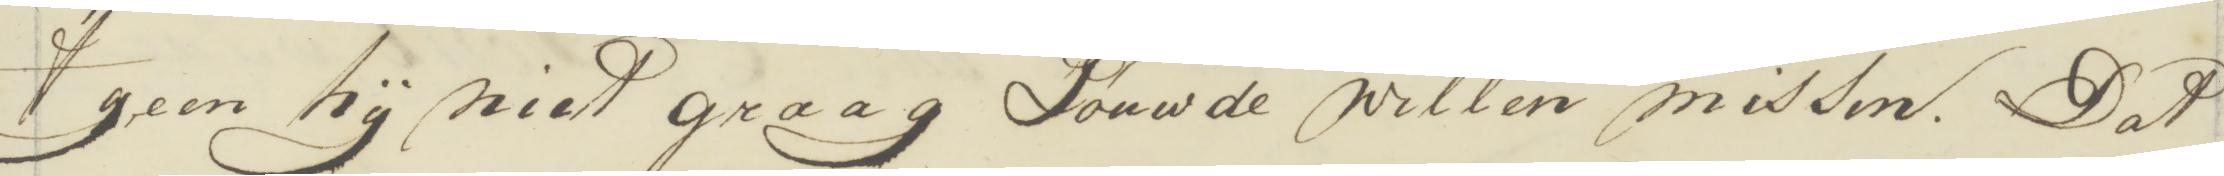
’t geen hij niet graag souwde willen missen. Dat
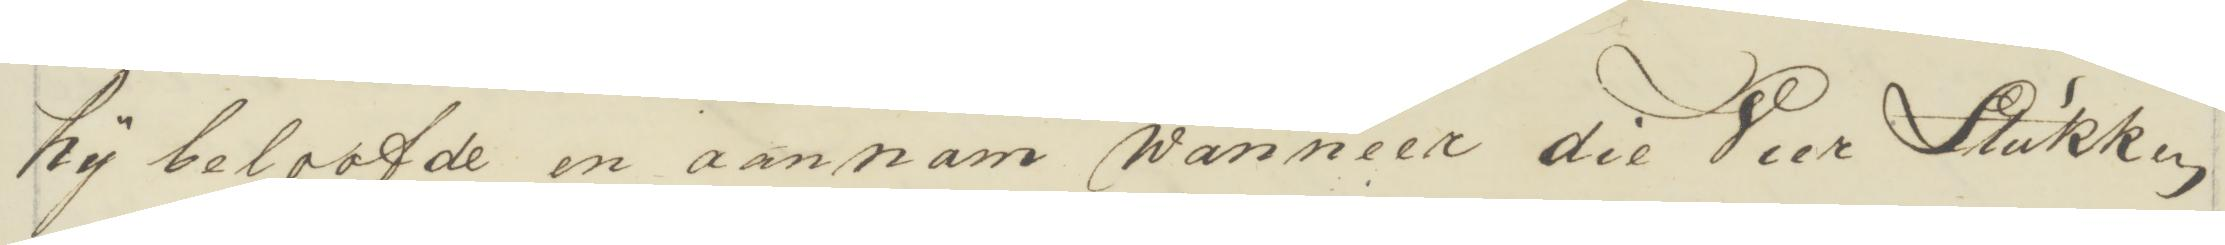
hij beloofde en aannam wanneer die Vier stukken
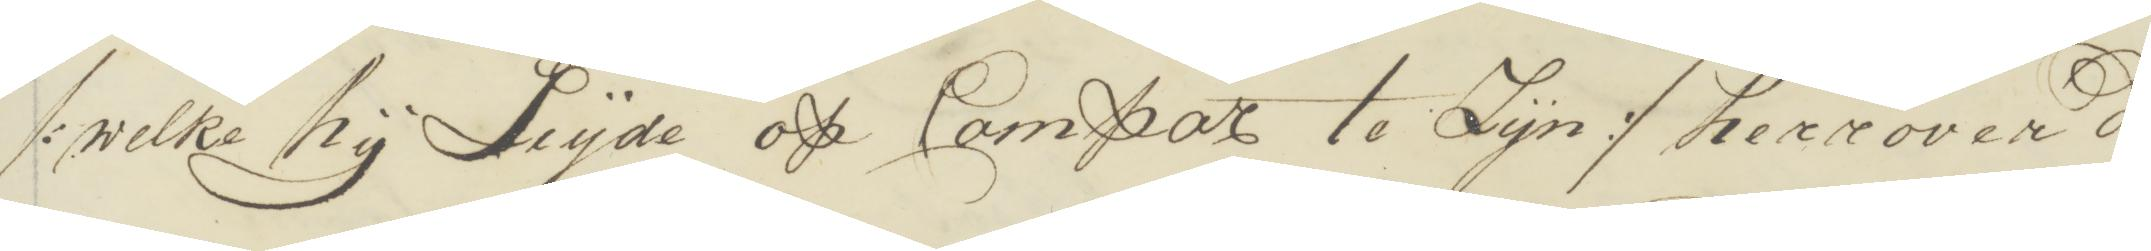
/: welke hij seijde op Campar te zijn :/ herroverd
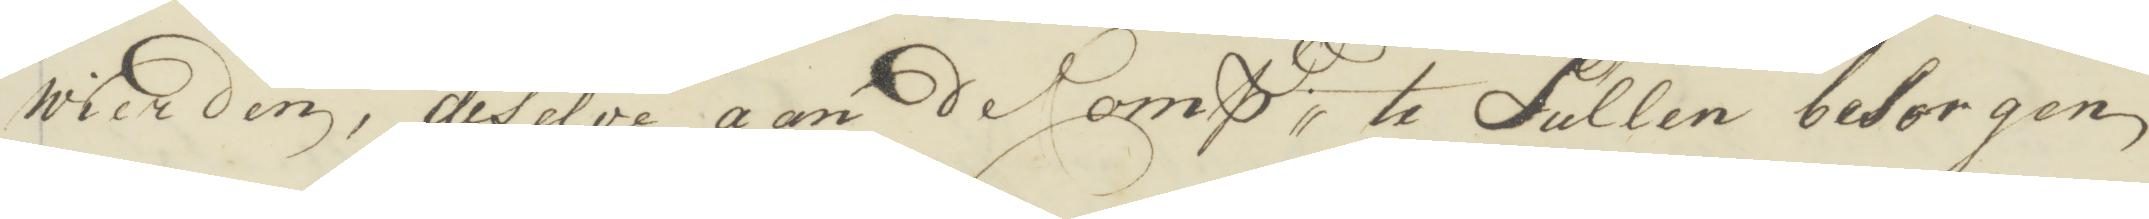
wierden, deselve aan de Comp„e te sullen besorgen
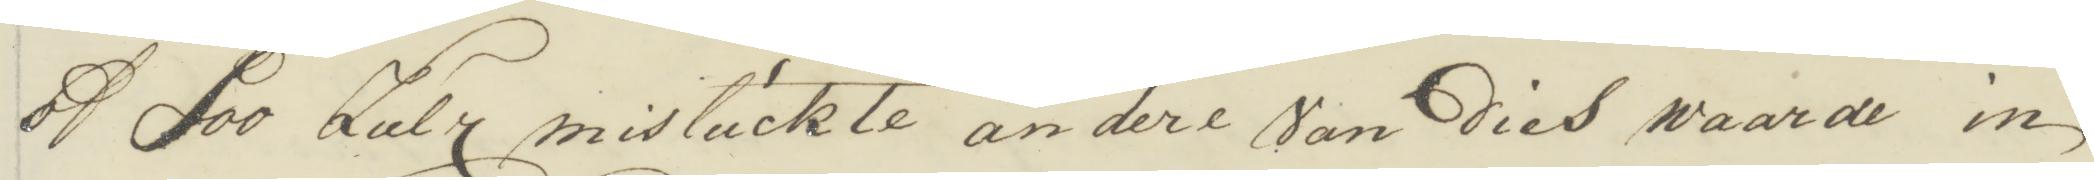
of soo zulx misluckte andere van dies waarde in
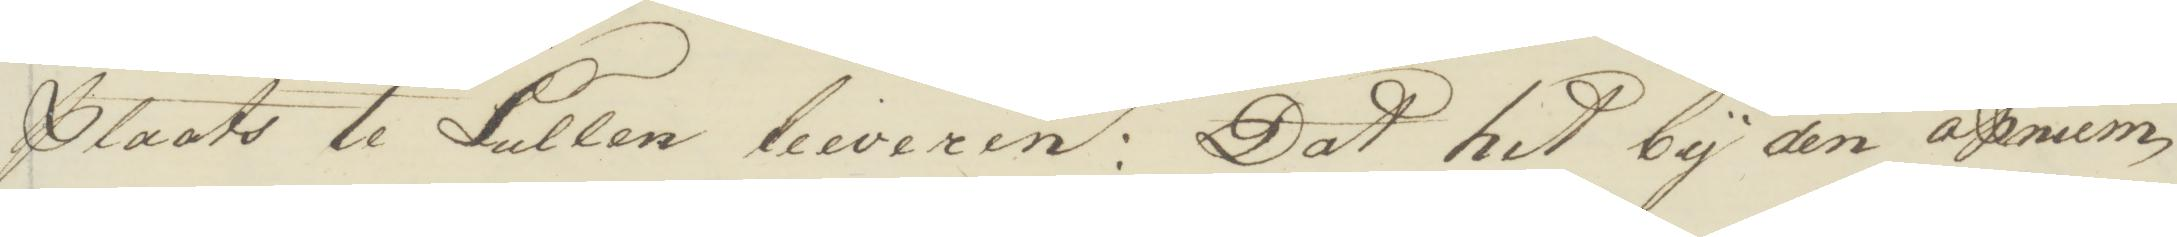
plaats te sullen leeveren: Dat het bij den opneem
